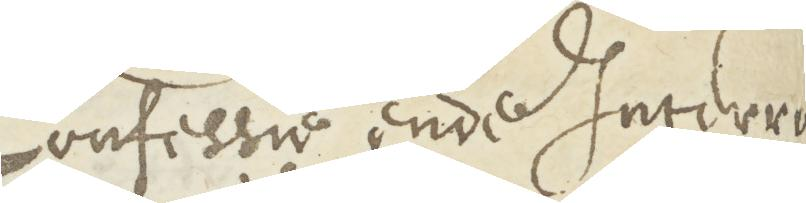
Confessie ende Jnterro
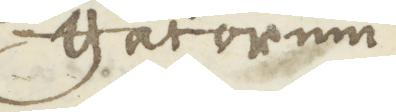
gatorium
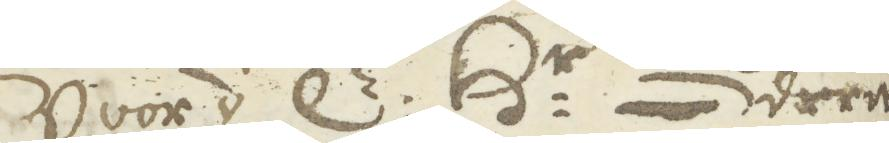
Voor d' E: h=r Gerrit
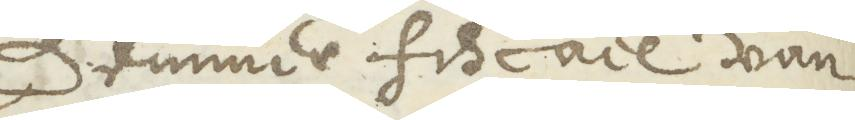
Demmer fiscael van
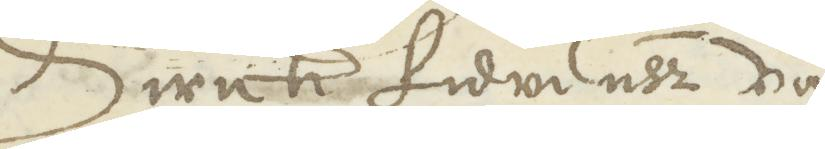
Sirick hierensz van
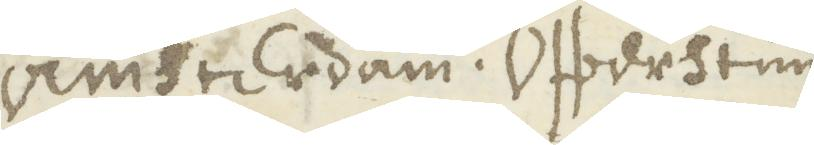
amsterdam. Opperstuijr.
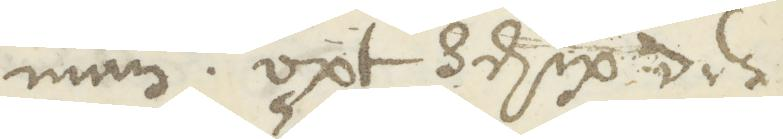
man . opt schip den
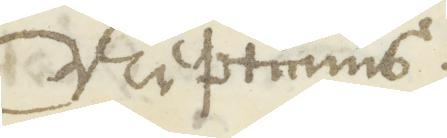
Neptunus.
